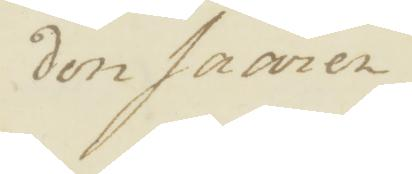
den Jaaren
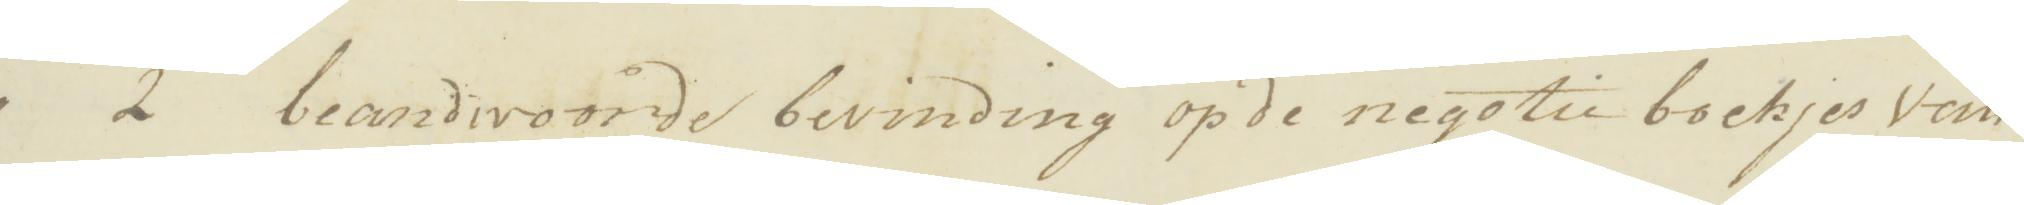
„ 2 beandwoorde bevinding op de negotie boekjes van
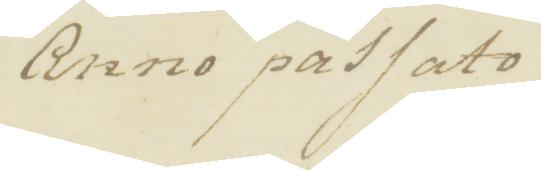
Anno passato
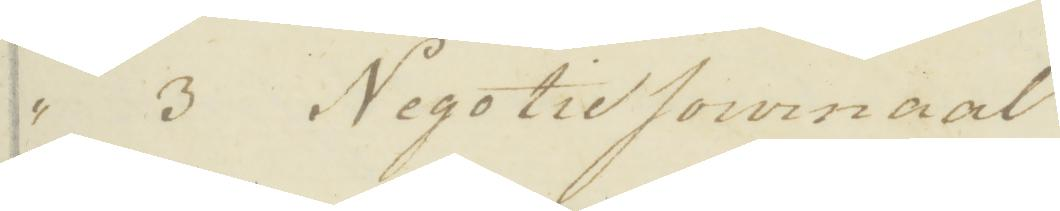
„ 3 Negotie Journaal
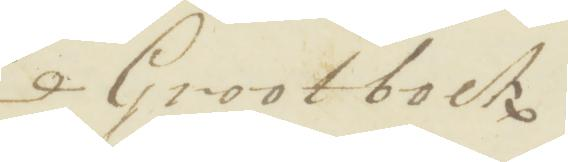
_o Grootboek
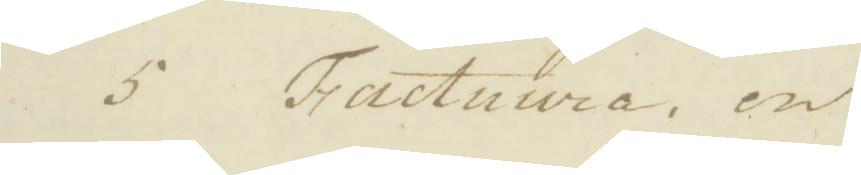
5 Factuura, en
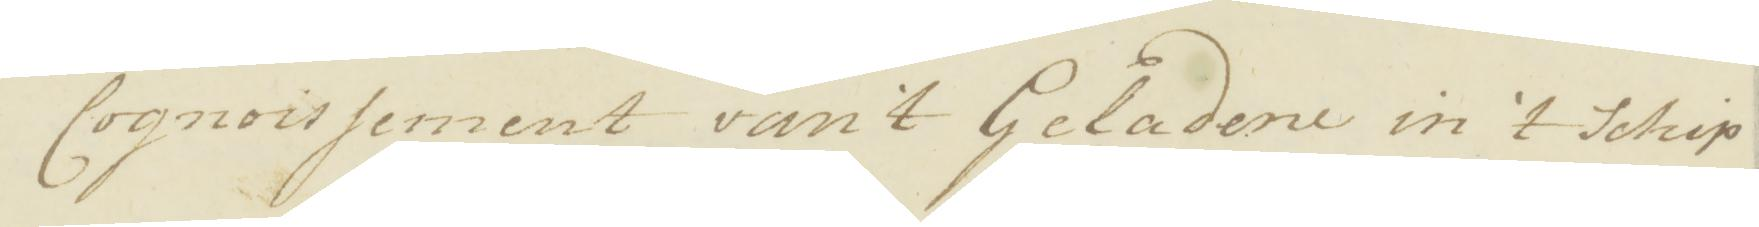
6 Cognoissement van ’t Geladene in ’t schip
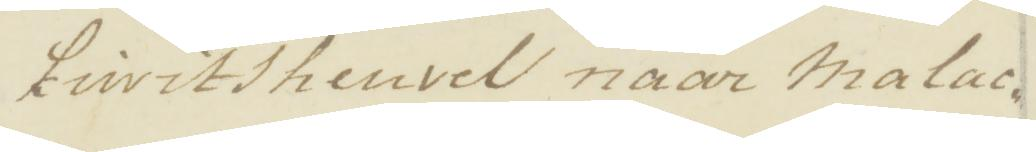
kiwitsheuvel naar malac„
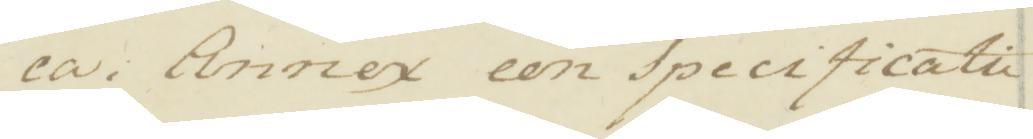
ca, Annex een specificatie
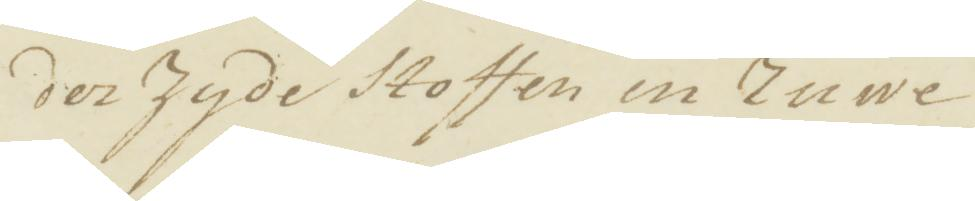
der zyde stoffen en ruwe
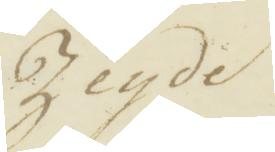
zeyde
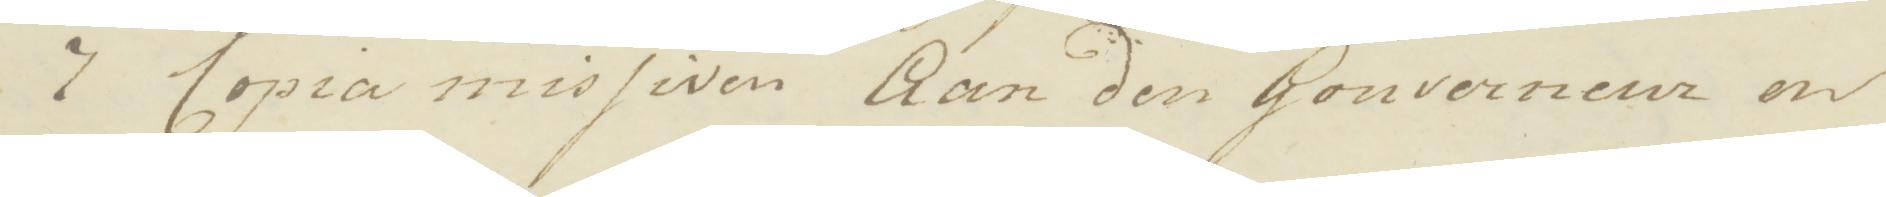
„ 7 Copia missiven Aan den Gouverneur en
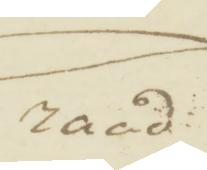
raad:
